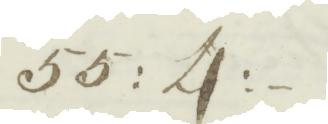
55: 4: -
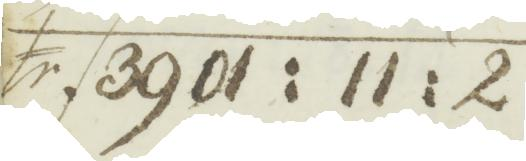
Tr. ƒ 3901 : 11 : 2
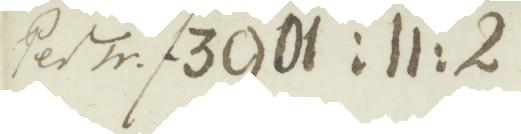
Per Tr. ƒ3081: 1: 2
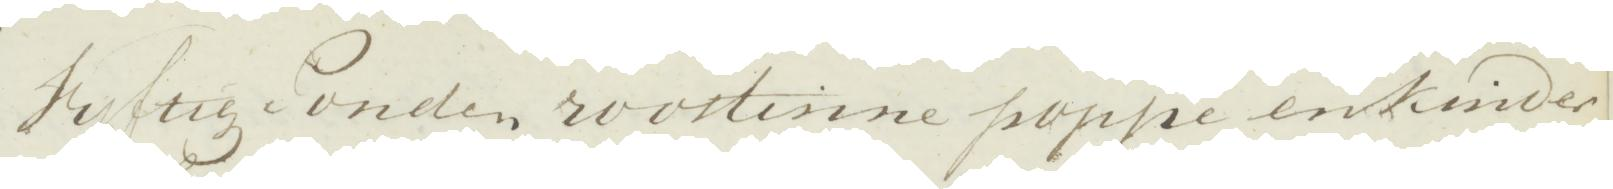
Vijftig Ponden roostinne poppe en kinder
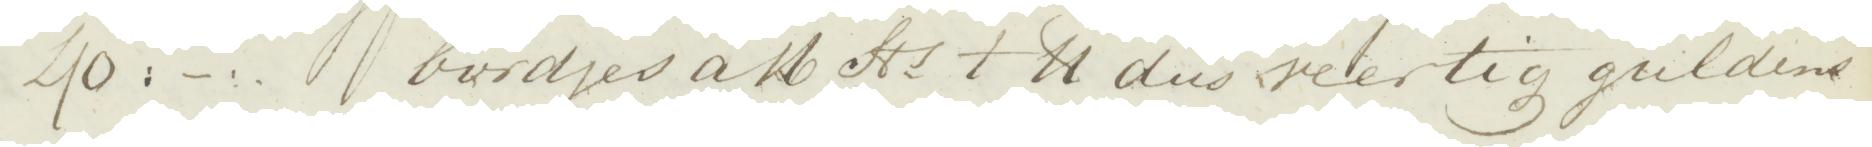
40 : - . bordjes a 16 st=s t lb dus veertig guldens
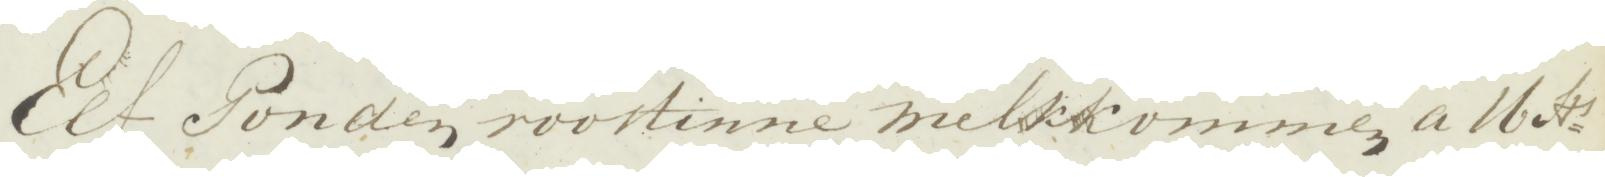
Eelf Ponden roostinnen melkkomen a 16 st-s
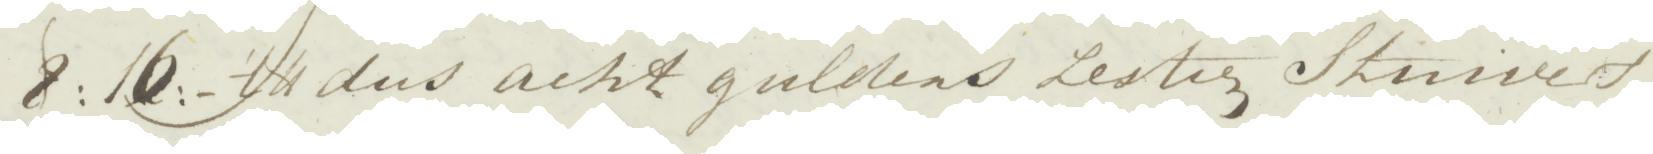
9; 16:- 't lb dus acht guldens zestien stuivers
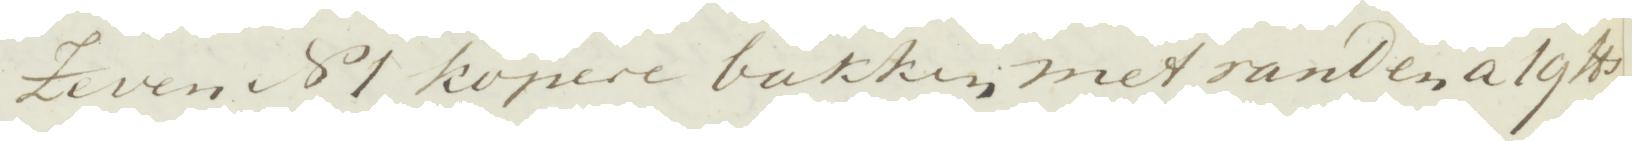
Zeven N1 kopere bakken met randen a 19 sts
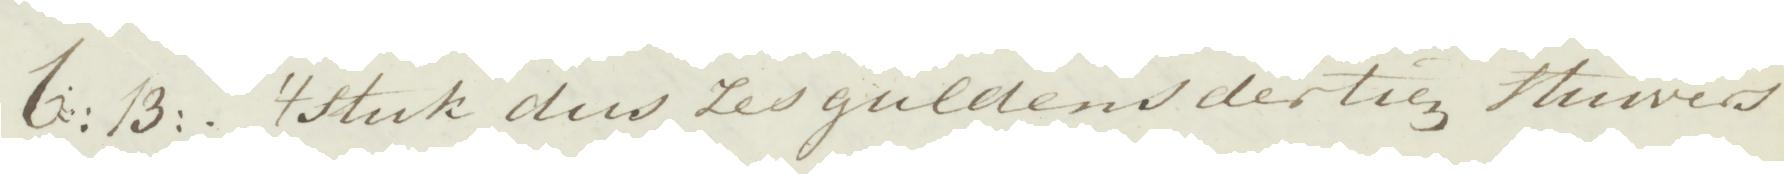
6: 13: - 't stuk dus zes guldens dertien stuivers
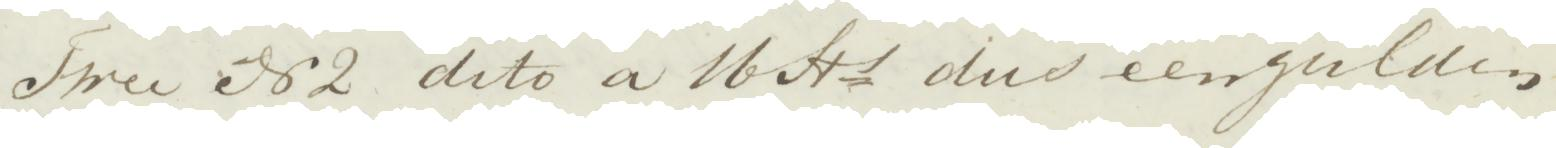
Twee N2 dito a 16 st=s dus een gulden
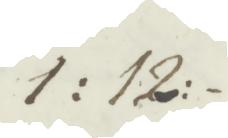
1: 12: -
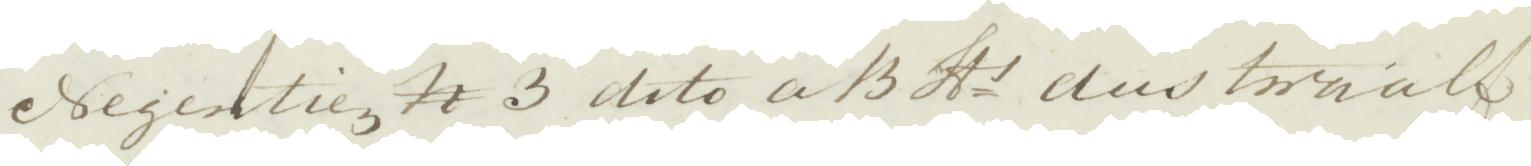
Negentien N 3 dito a 13 st=s dus twaalf
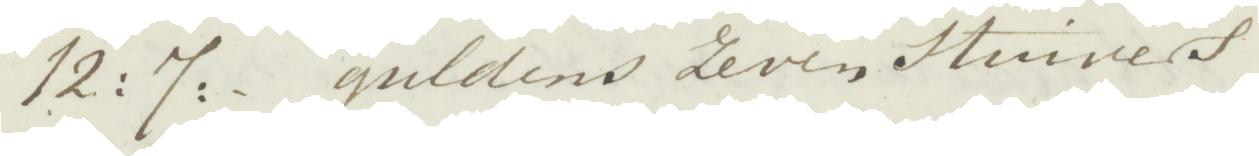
12:7: - guldens zeven stuivers
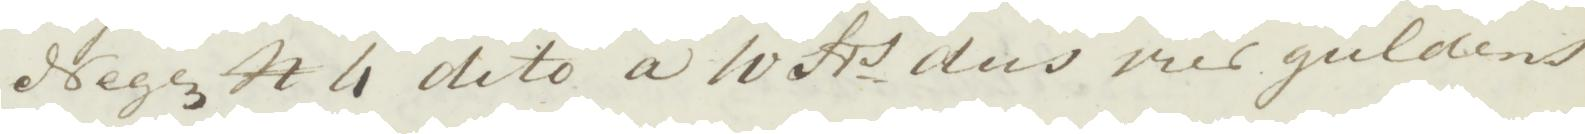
Negen N 4 dito a 10 st=s dus vier guldens
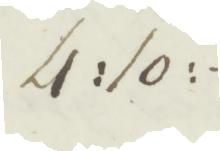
4:10:
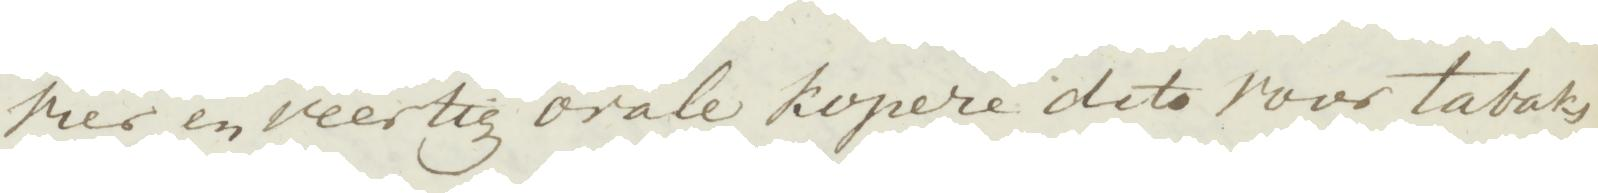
vier en veertig ovale kopere dito voor tabaks
